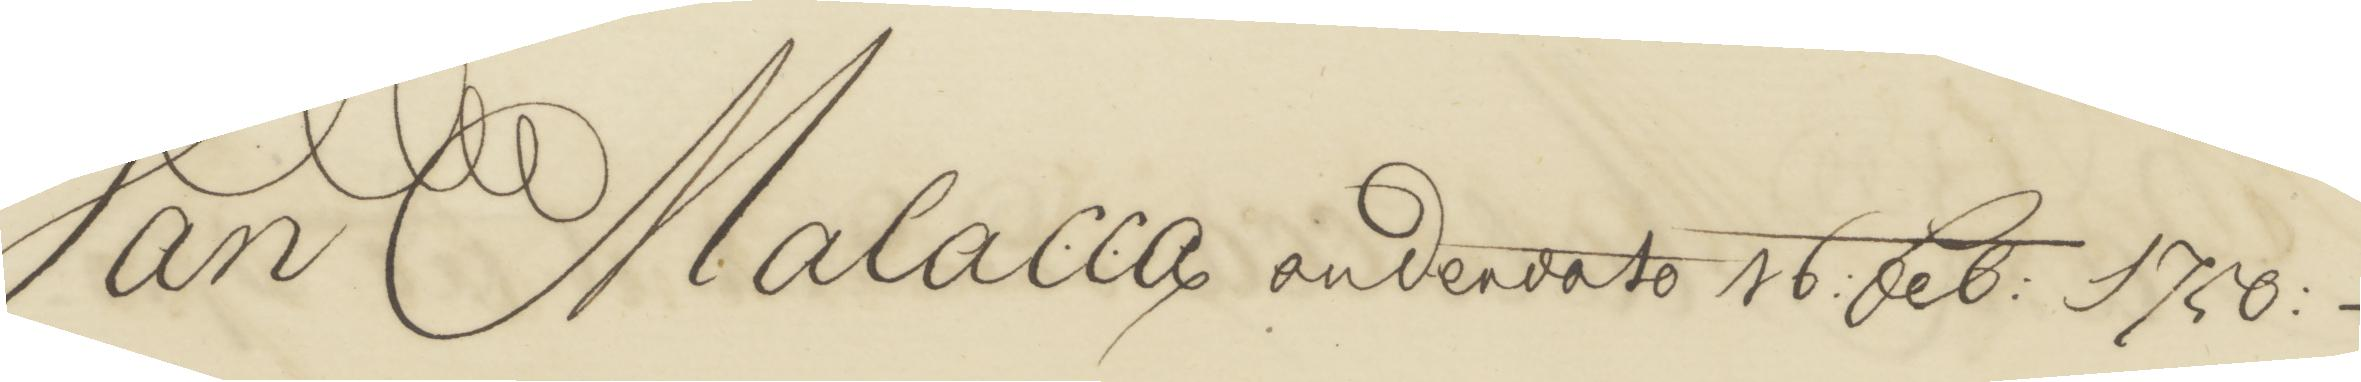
Van Malacca onder dato 16: feb: 1750: —
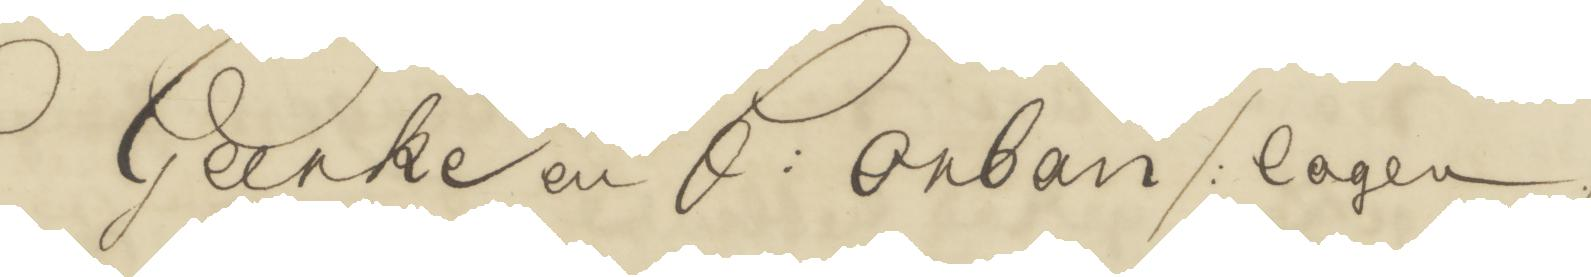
Geerke en F: orban /: lager
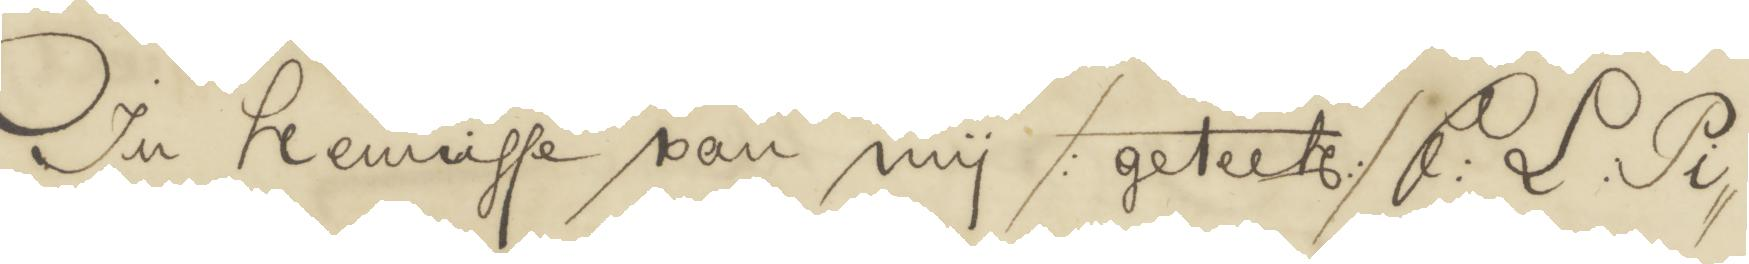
In kennisse van mij /: geteek :/ F: L. Pi„
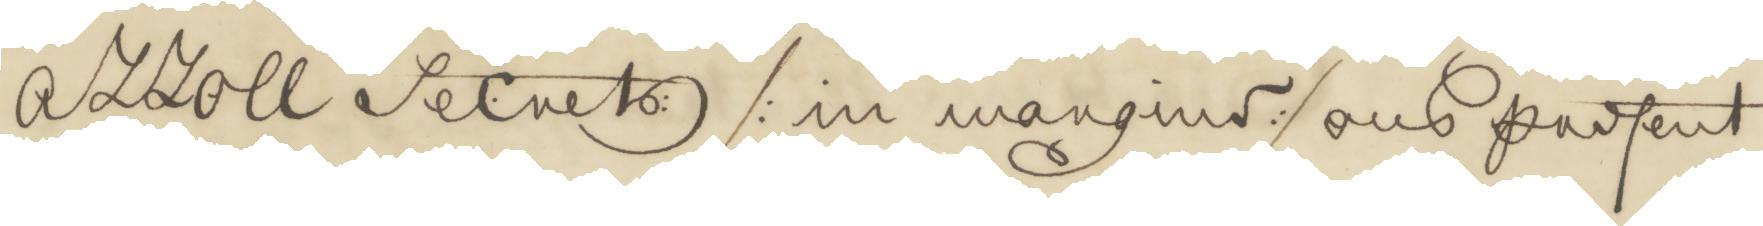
azzoll secrets: /: in margine :/ ons present
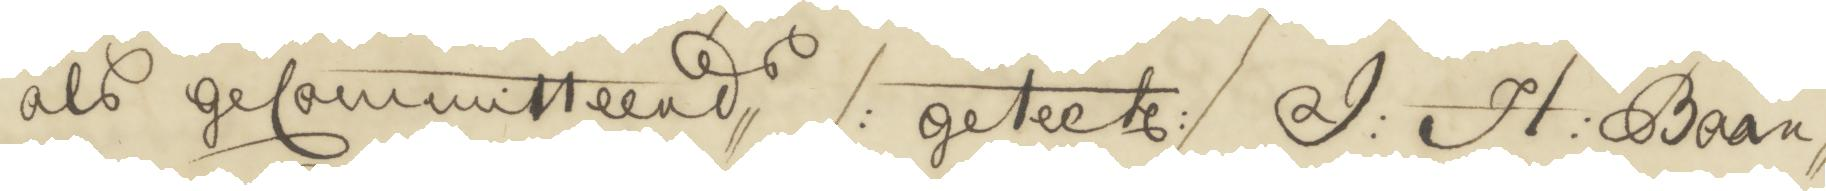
als gecommitteerd„s /: geteek :/ I: H: Baar
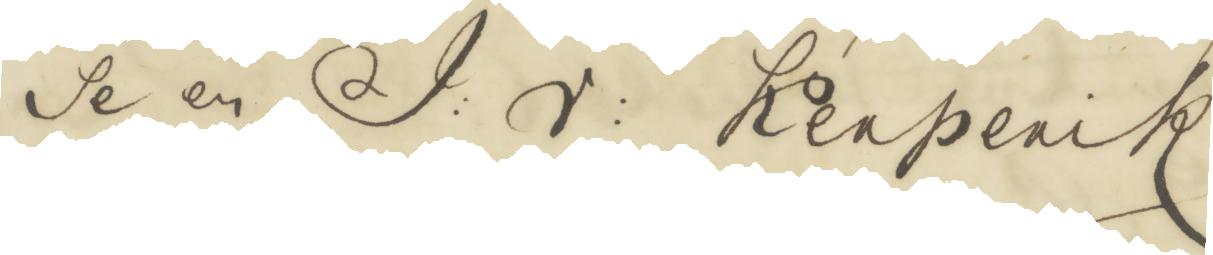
se en I: v: Kerperik
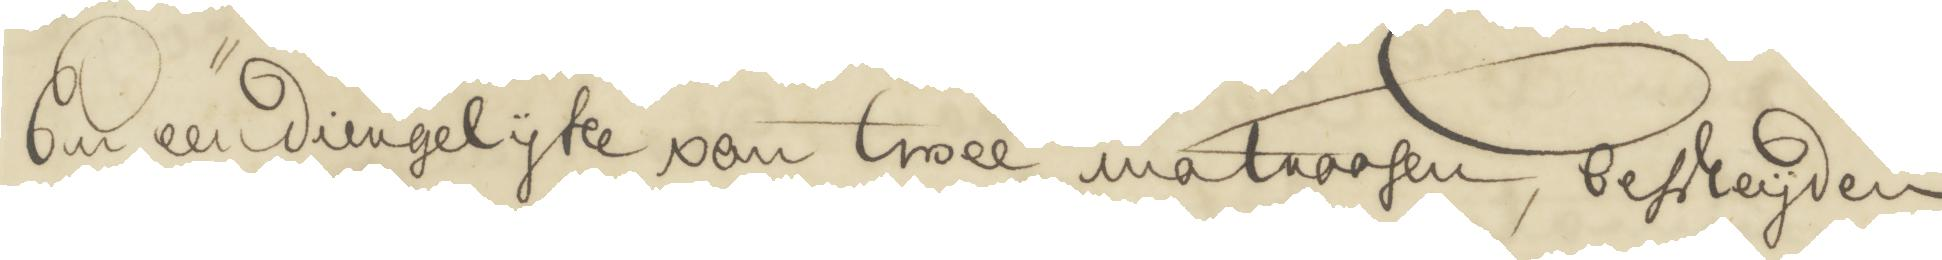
En een diergelijke van twee matroosen, bescheijden
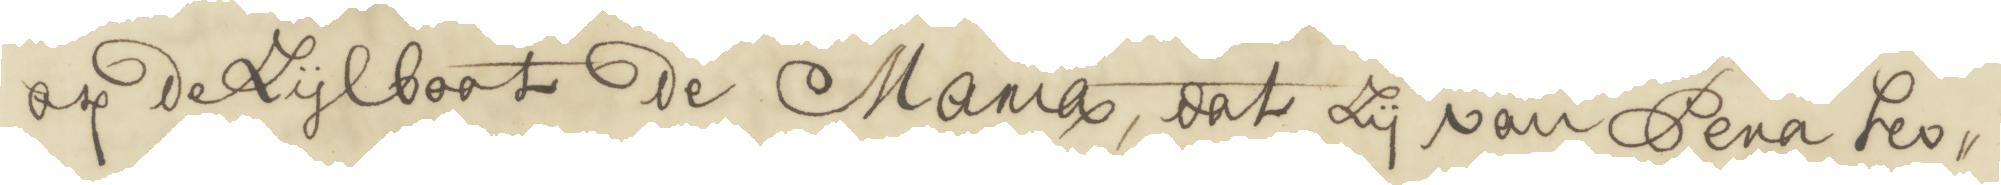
op de zijlboot de Maria, dat zij van Pera ko„
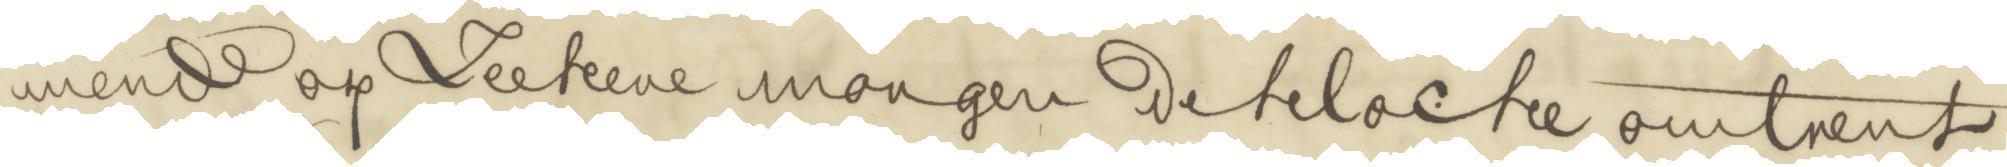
mende op Zeekere morgen de klocke omtrent
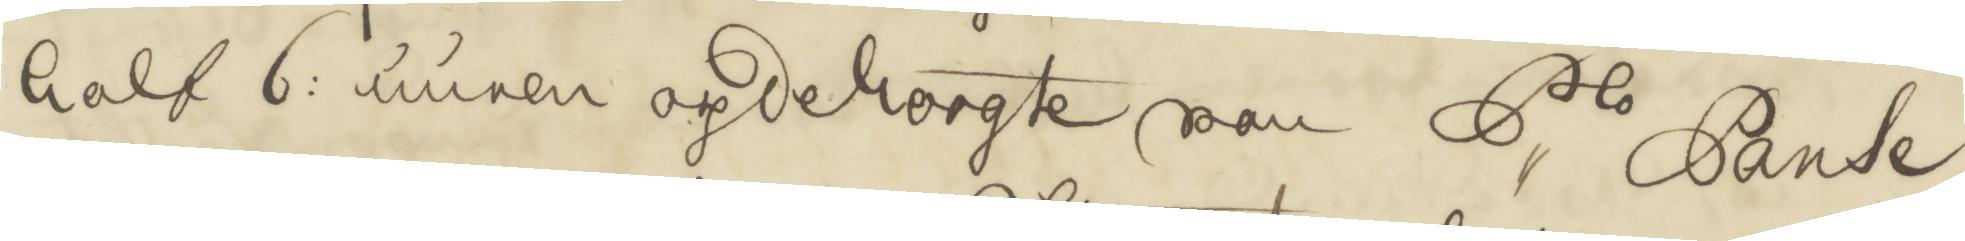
half 6: uuren op de hoogte van P„lo Panse
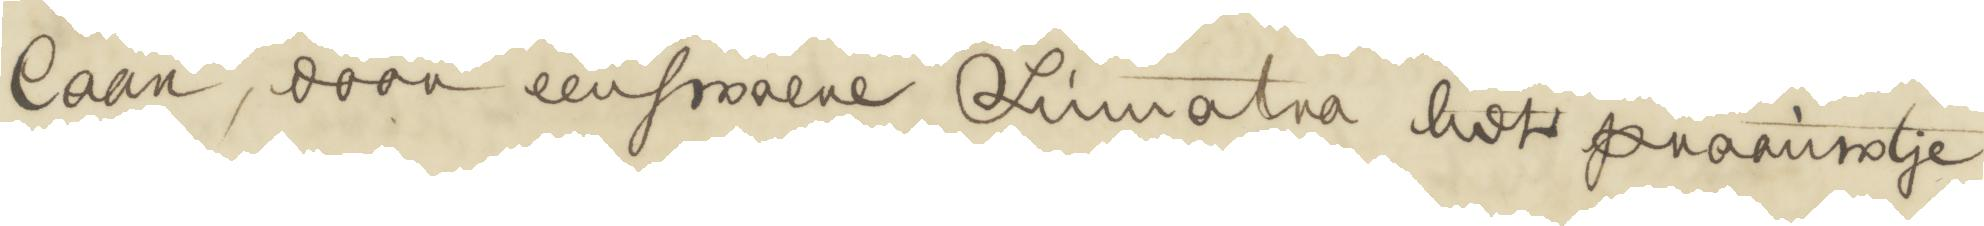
laar, door een swaere Sumatra het praauwtje
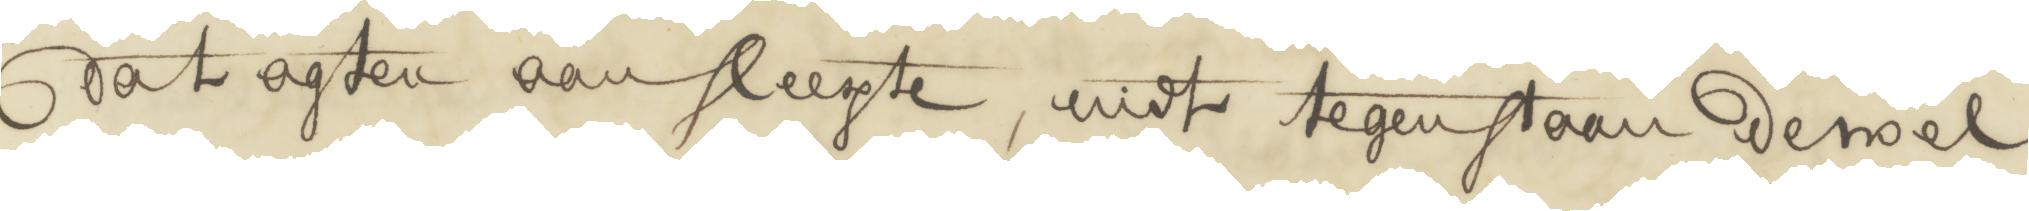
dat agter aansleepte, niet tegen staan de wel
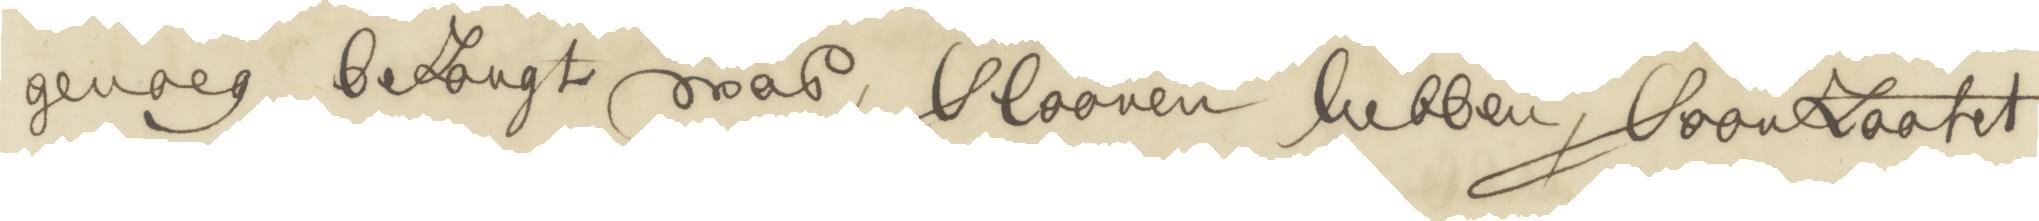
genoeg bezorgt was, verlooren hebben, veroorzaakt
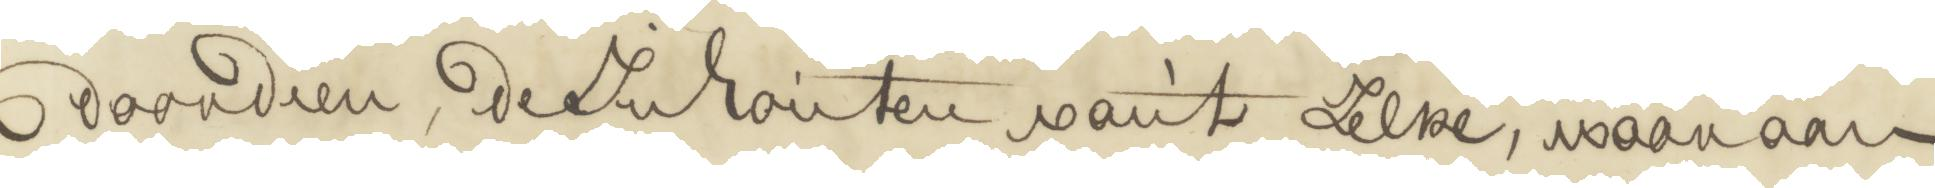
door dien, de Inhouten van 't zelve, waaraan
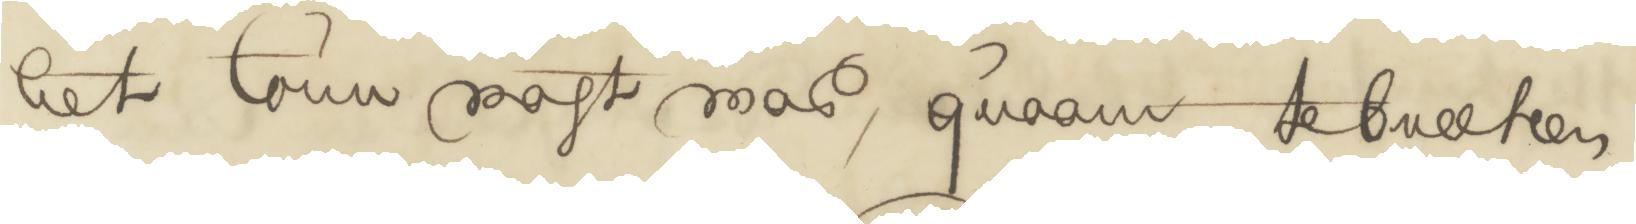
het touw vast was, quaam te breeken
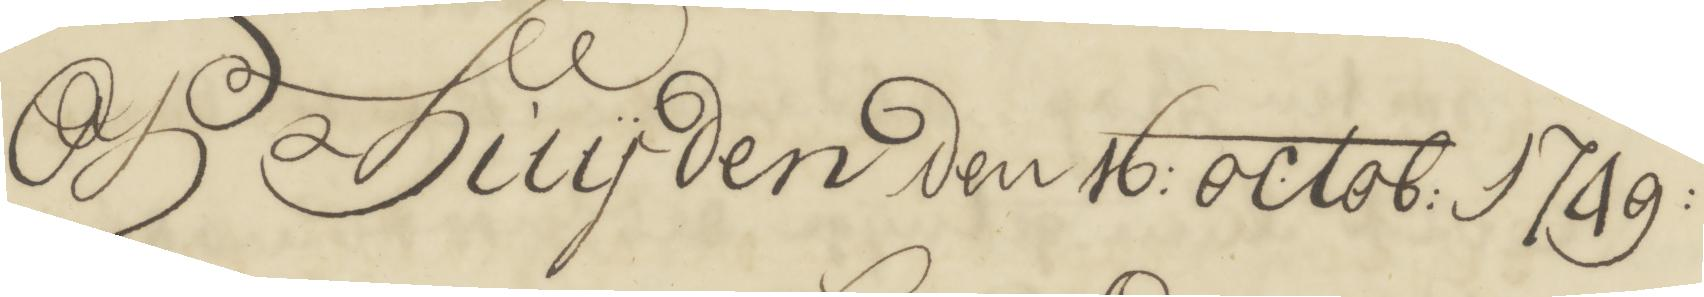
Op huijden den 16: octob: 1749:
